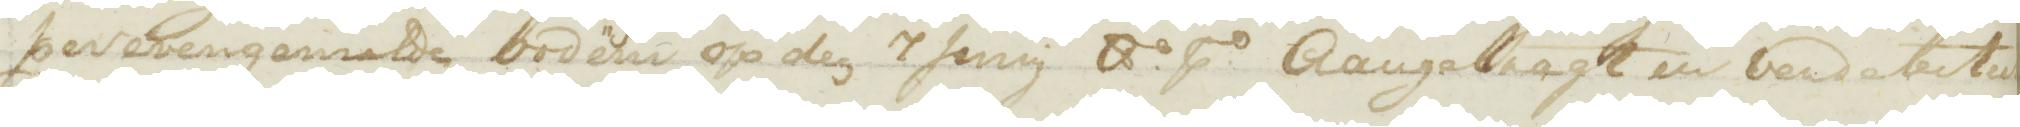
per evengemelde bodem op den 7 junij a.o p:o Aangebragt en verdebitee
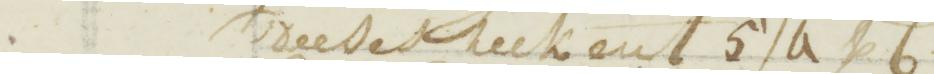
. deeses reekent 5¼ pC
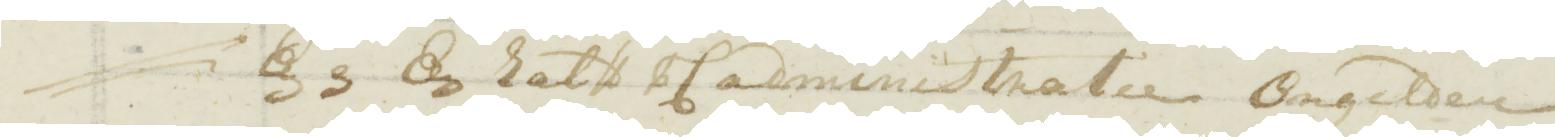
= Een en Een halff pC administratie Ongelden
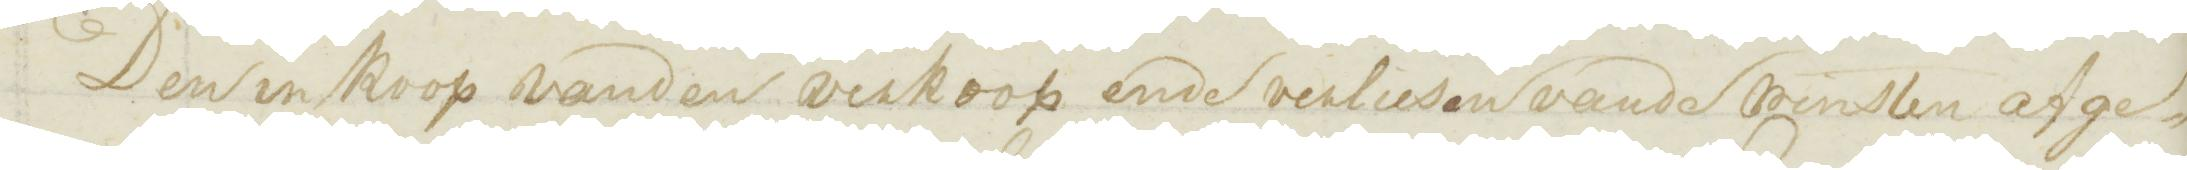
Den inkoop vanden verkoop ende verliesen vande winsten afge
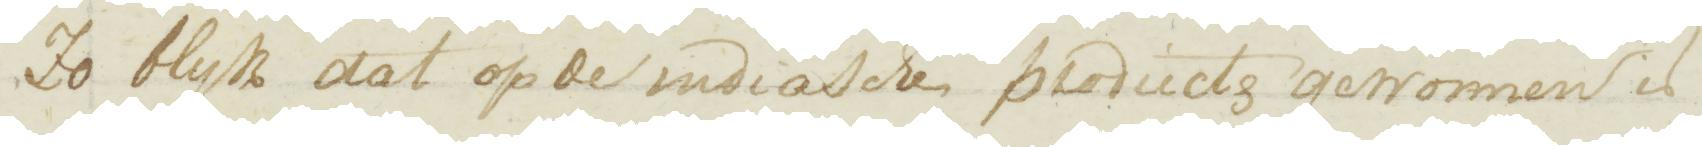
zo blyk dat op de indiasche producten gewonnen is
